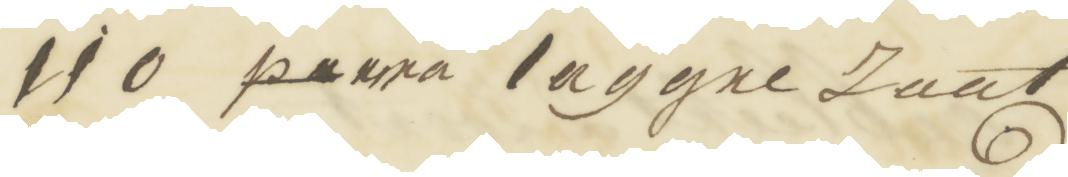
110 parra taggre zaat
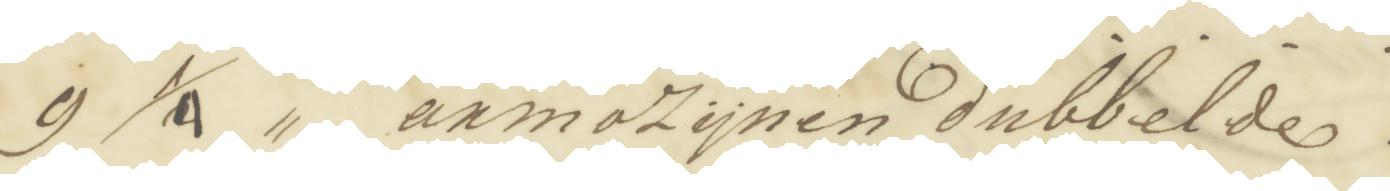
9 1/4 „ armozijnen dubbelde
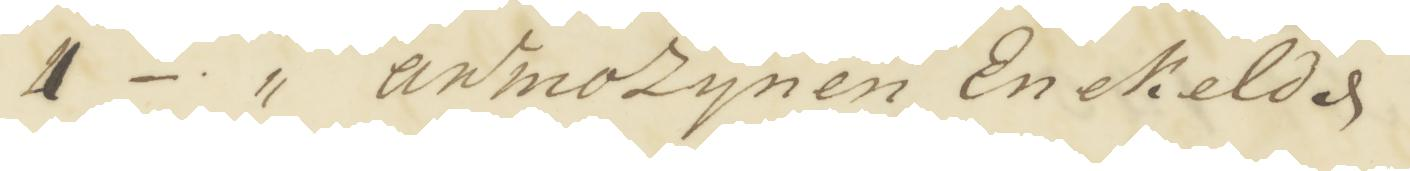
4 — . „ armozijnen Enckelden
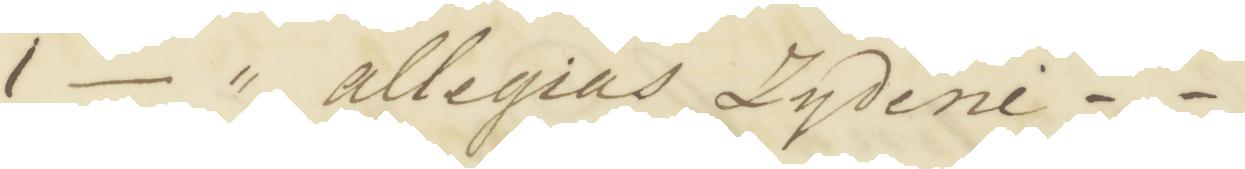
1 — „ allegias zydene - -
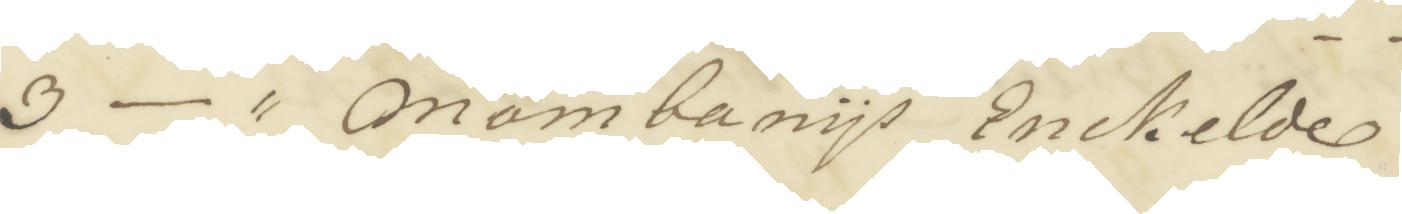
3 — „ mombanijs Enckelde
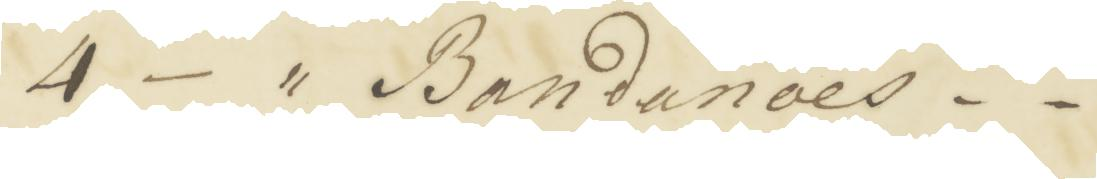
4 — „ Bandanoes - -
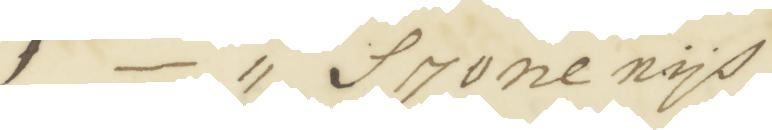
1 — „ sjone rijs
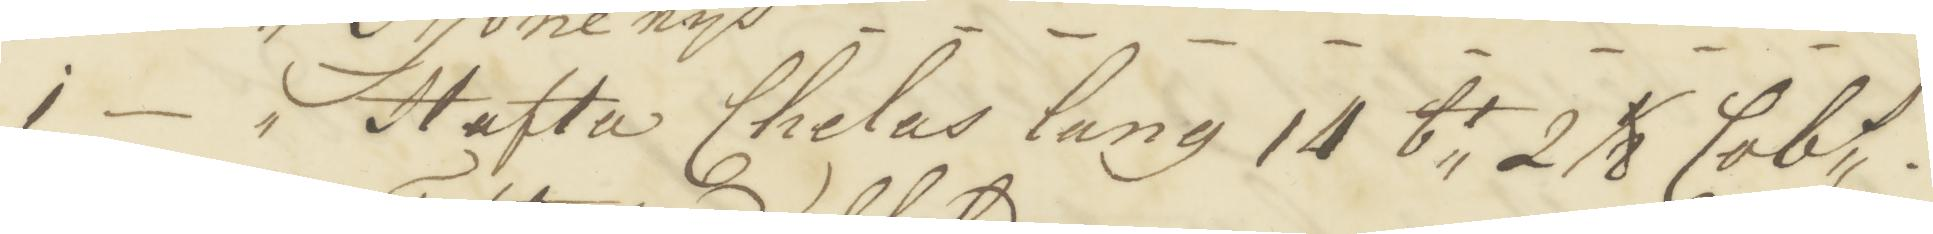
1 — „ Hafta Chelas lang 14 b„t 2 1/8 Cob„s
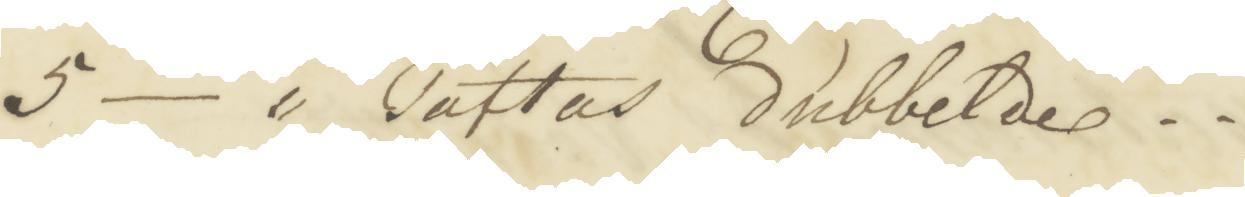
5 — „ Taftas dubbelde - -
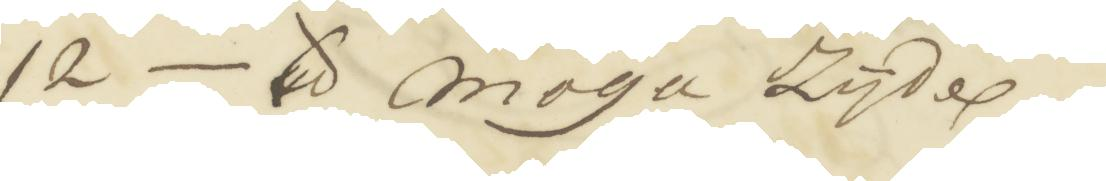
12 — lb moga zijde -
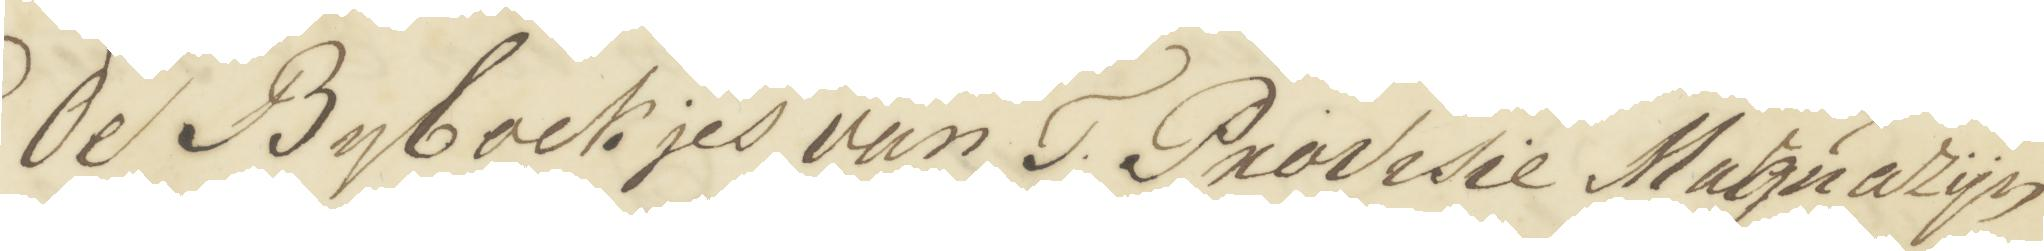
de Byboekjes van T. Provisie Maguazijn
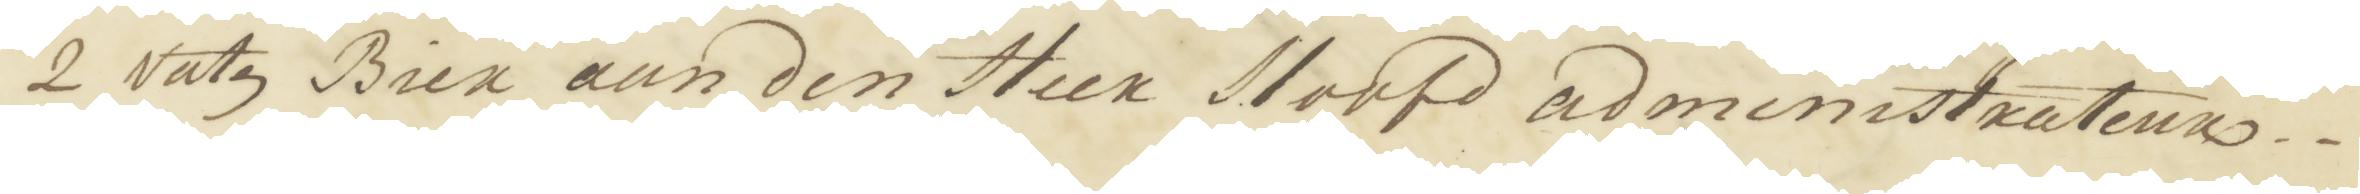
2 vaten Bier aan den Heer Hoofd administrateur
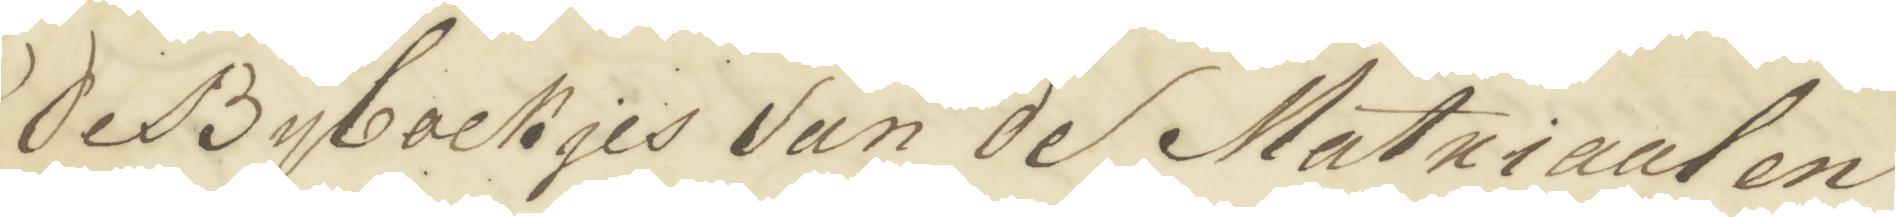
de Byboekjes van de Matriaalen
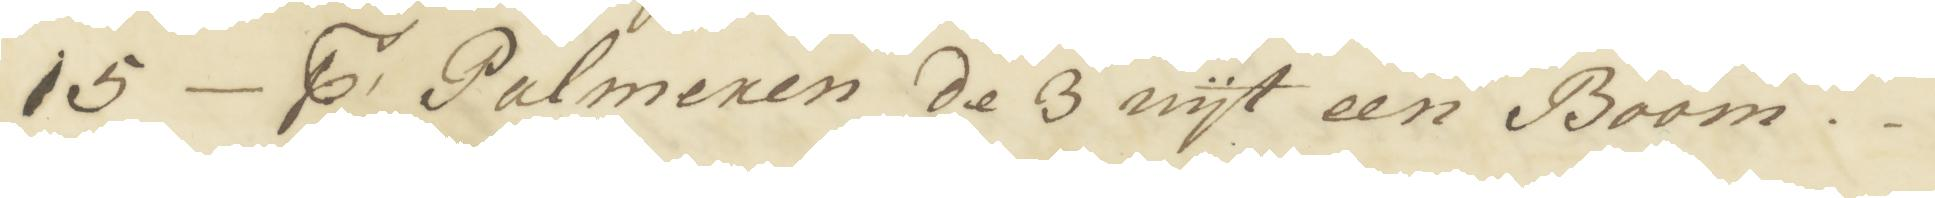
15 — p,s Palmeren de 3 uijt een Boom . -
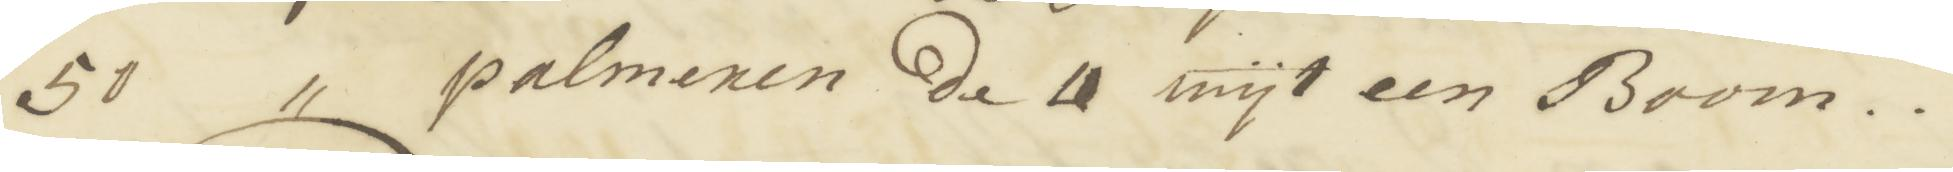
50 „ palmeren de 4 uijt een Boom . .
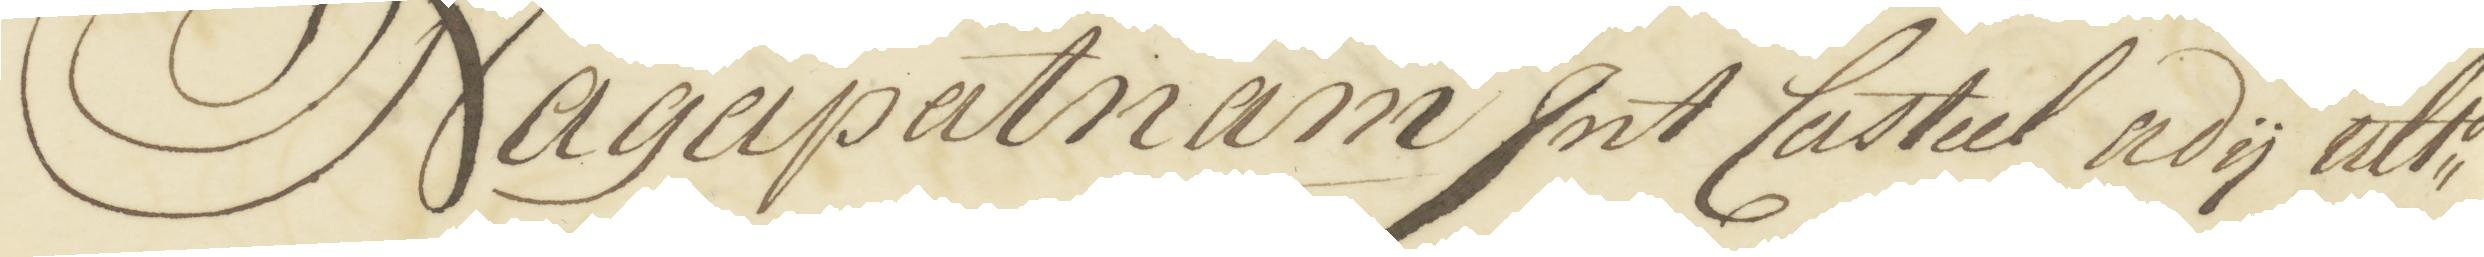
Nagapatnam Jnt Casteel adij ult„o
